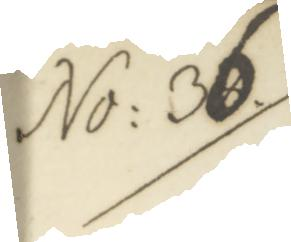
No: 36.
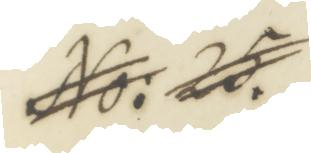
No: 25.
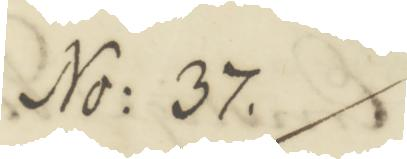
No: 37.
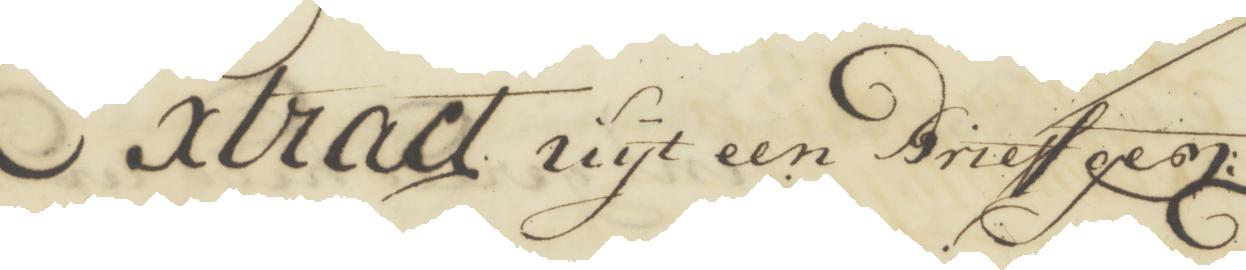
Extract uijt een Brieff gesz:
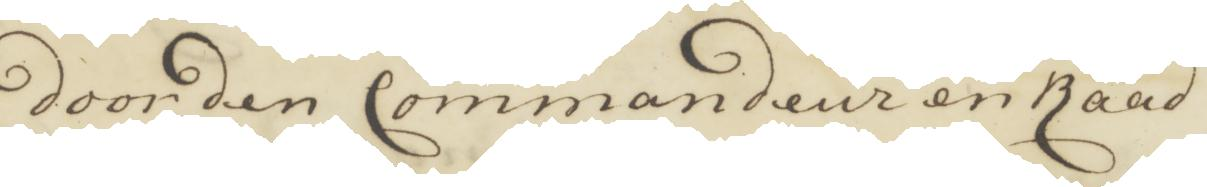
door den Commandeur en Raad
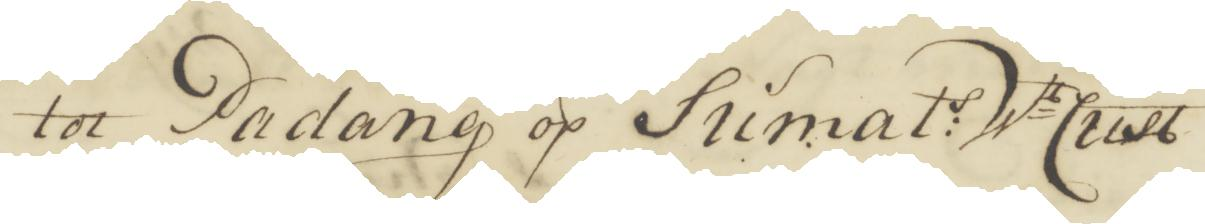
tot Padang op Sumat:s W=t Cust
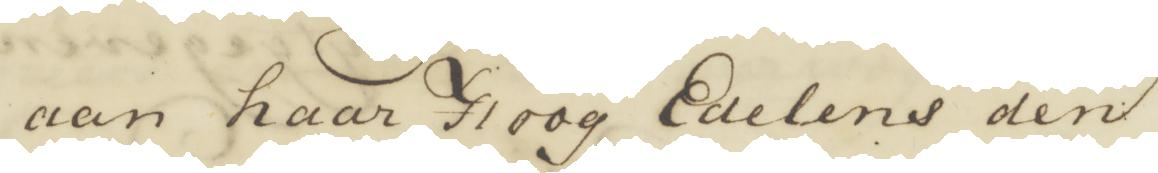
aan haar Hoog Edelens den
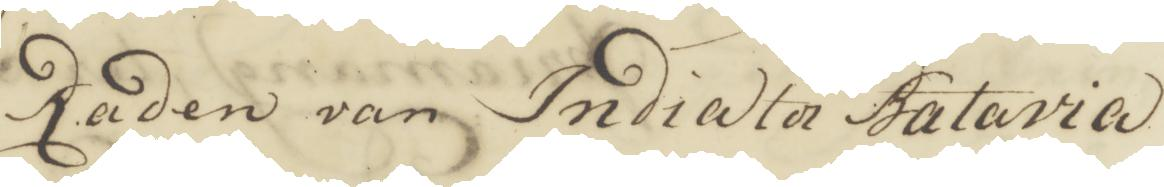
Raden van Jndia tor Batavia
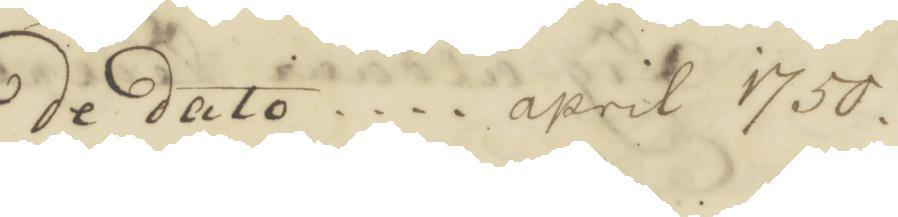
de dato . . . . april 1750.
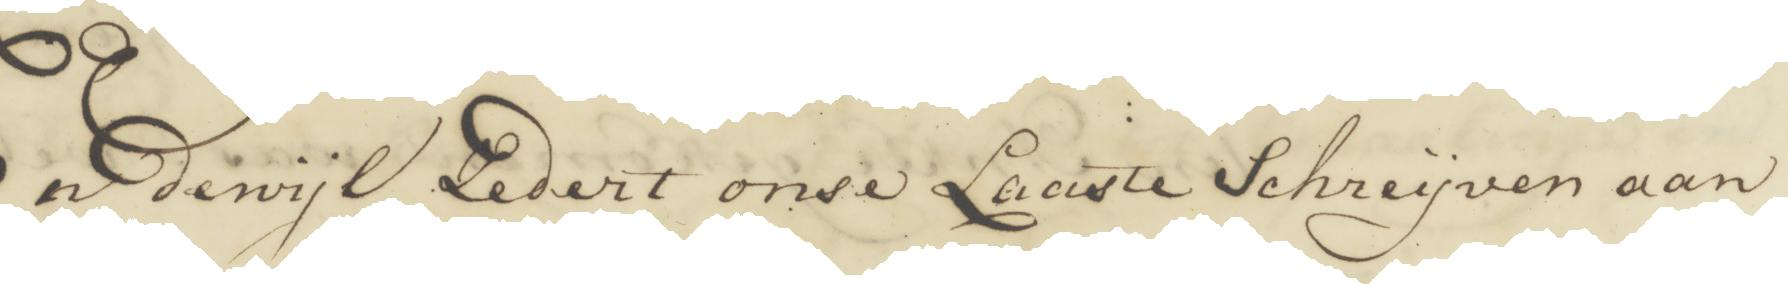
En dewijl zedert onse Laaste schreijven aan
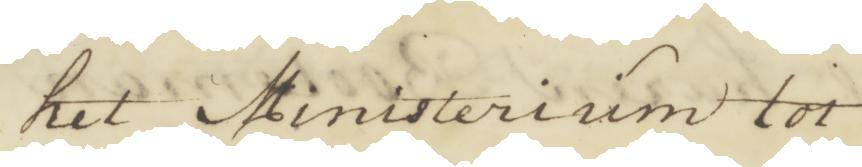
het Ministerium tot
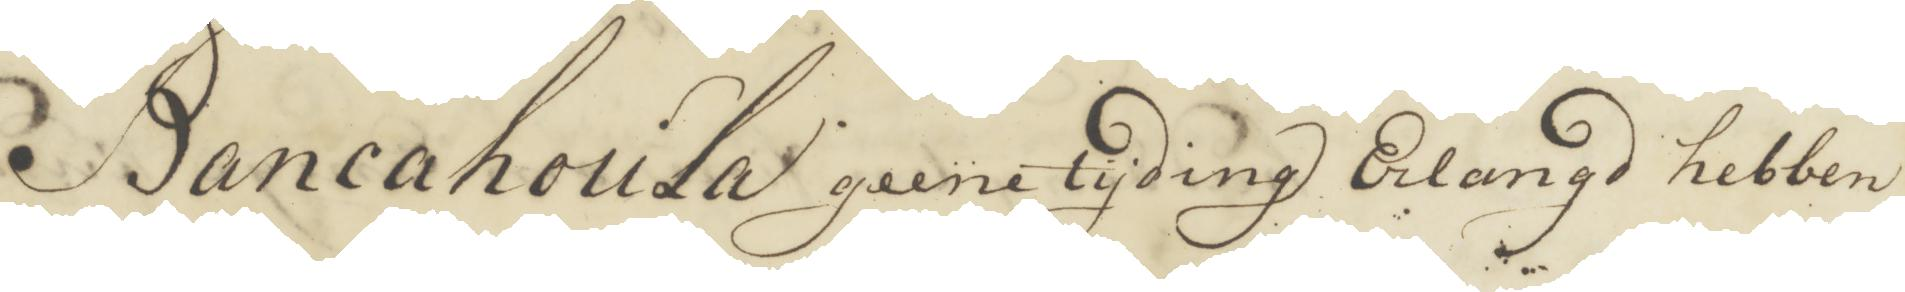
Bancahoula geene tijding Erlangd hebben
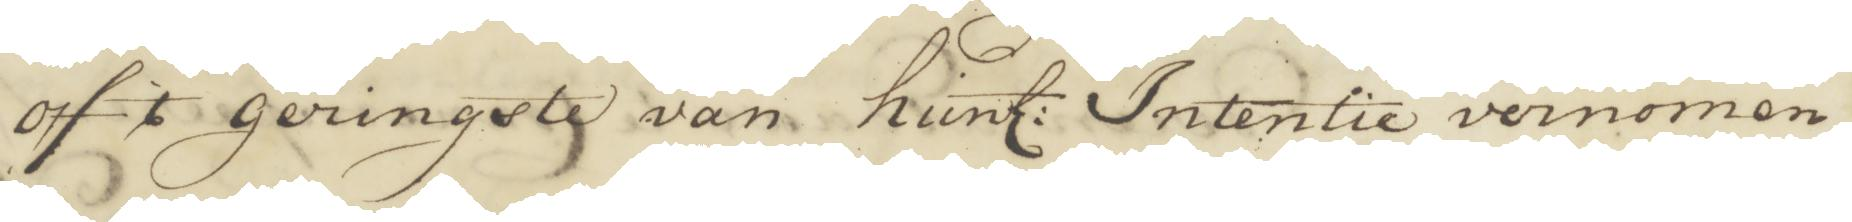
of ’t geringste van hunl: Jntentie vernomen
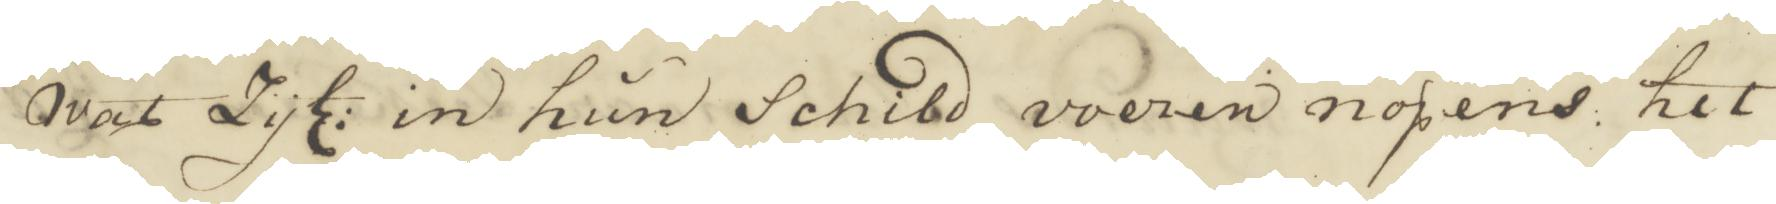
wat zijl: in hun schild voeren nopens het
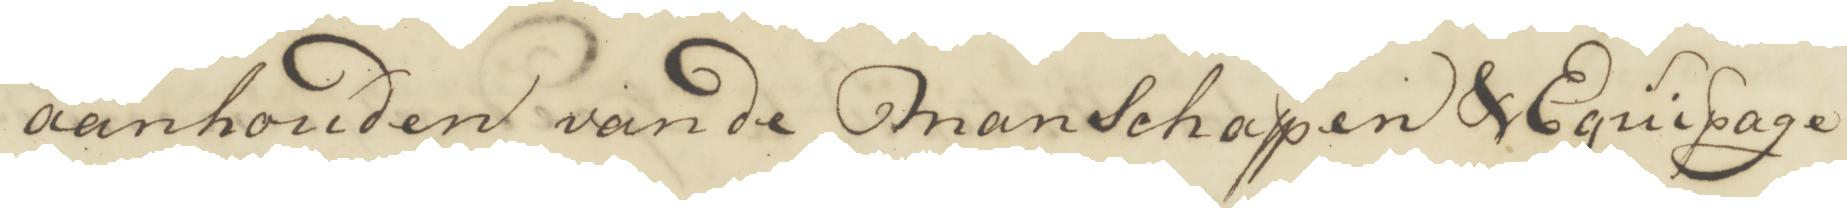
aanhouden van de manschappen & Equipage
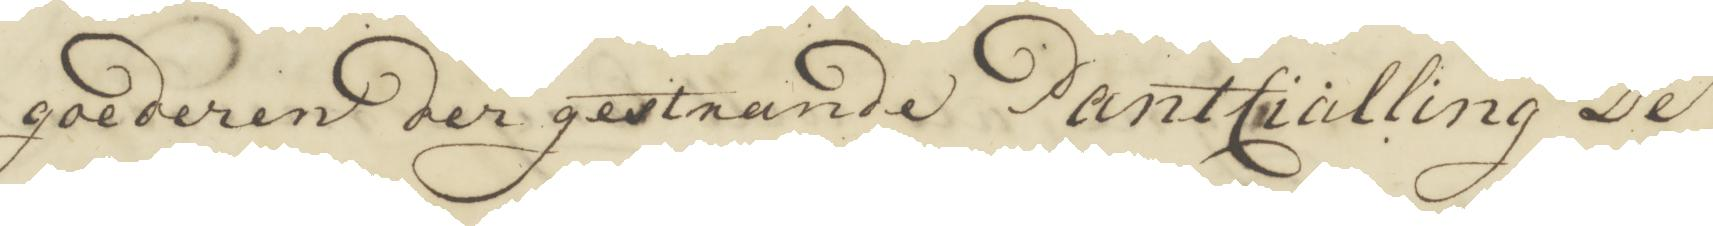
goederen der gestrande Pantcialling De
